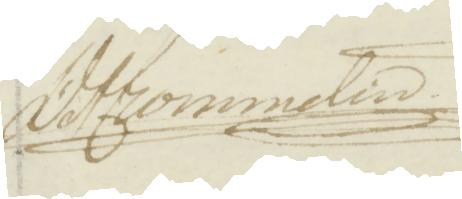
D. J. Crommelin
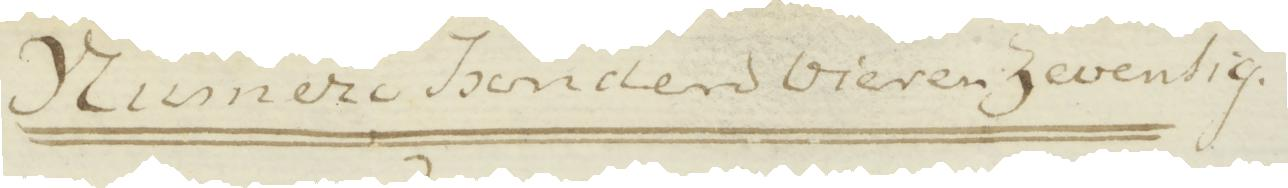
Numero Honderd Vieren zeventig.
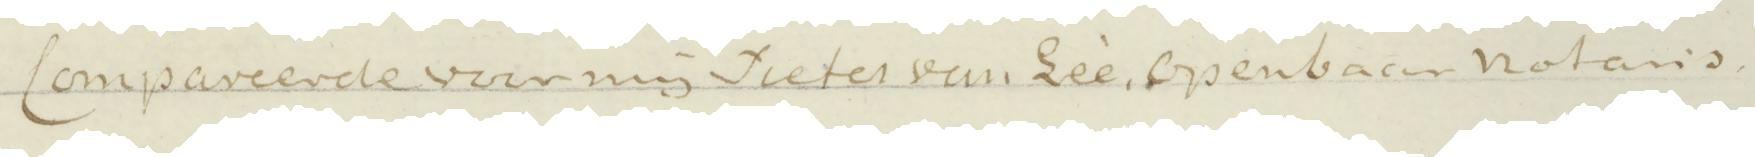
Compareerde voor mij Pieter van Lee, Openbaar notaris
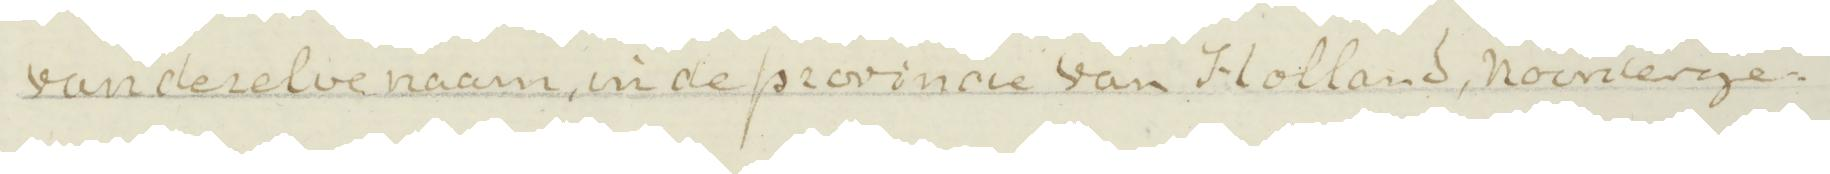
van dezelve naam in de provincie van Holland, noorderge.
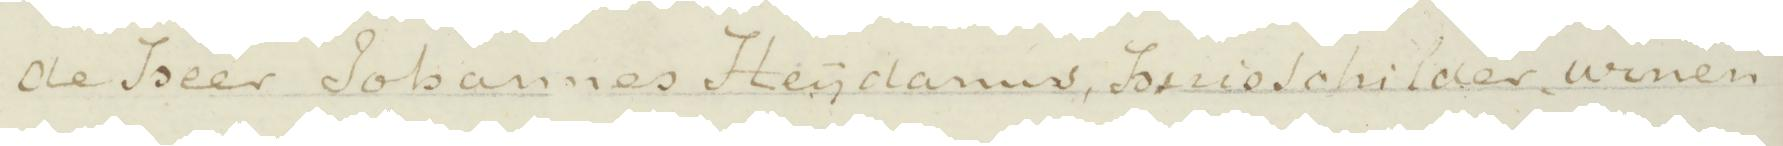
de heer Johannes Heijdanus, huisschilder wonen
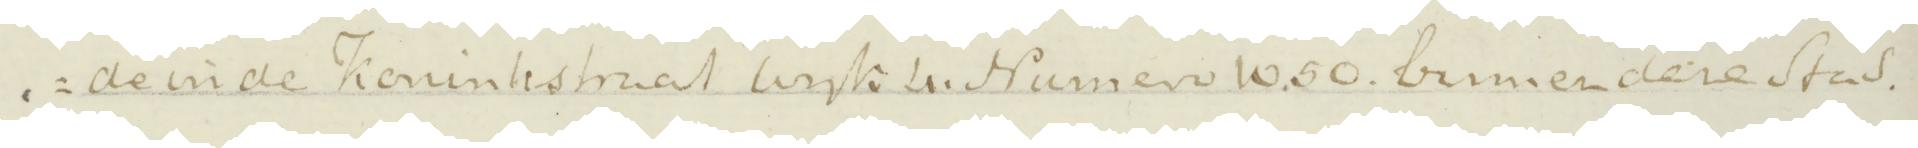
,=de in de Koninkstraat wijk 4. Numero 10.50, binnen deze stad.
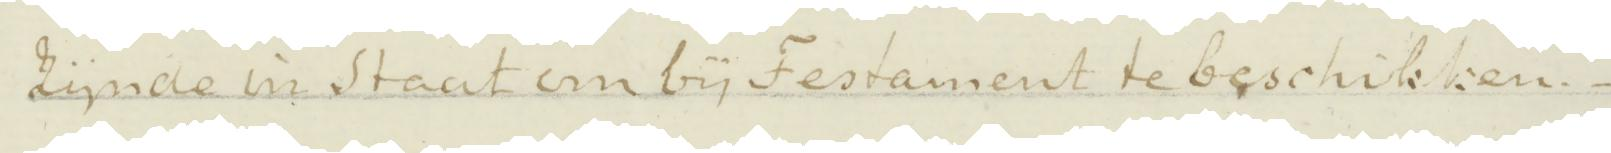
Zijnde in staat om bij Testament te beschikken.
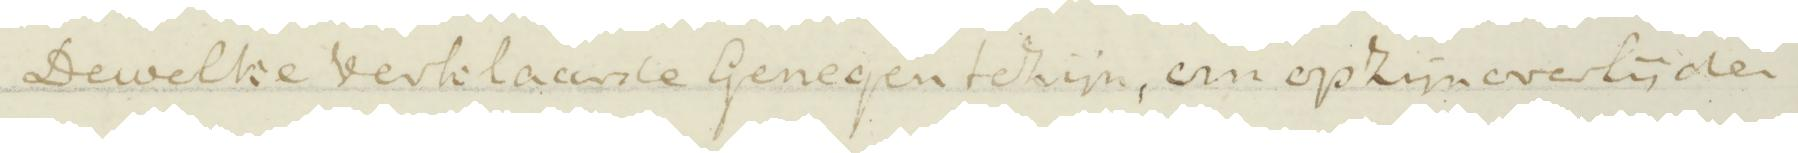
Dewelke verklaarde Genegen te zijn, om op zijn overlijden
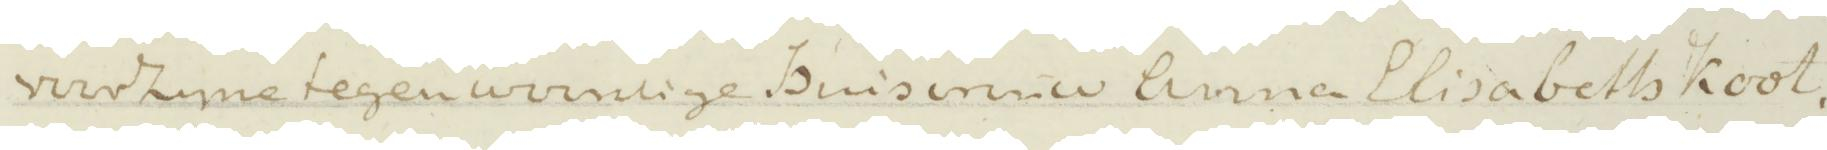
voor Zijne tegenwoordige huisvrouw Anna Elisabeth Koot
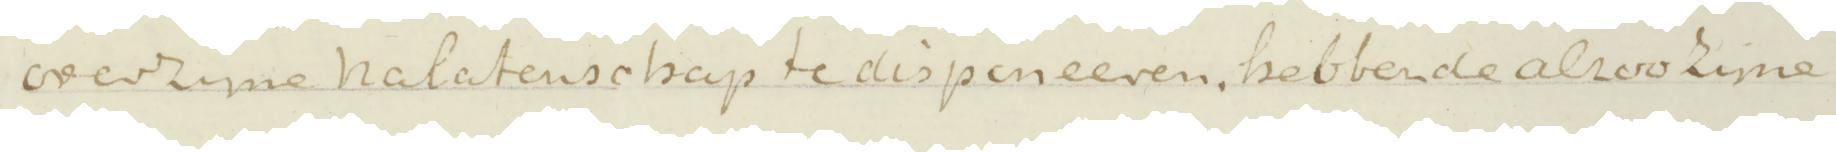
over zijne nalatenschap te disponeeren, hebbende alzoo zijne
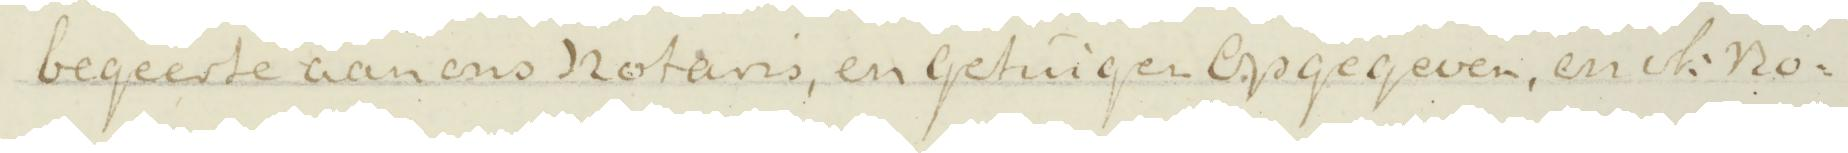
begeerte aan ons Notaris, en getuigen Opgegeven, en ik No.
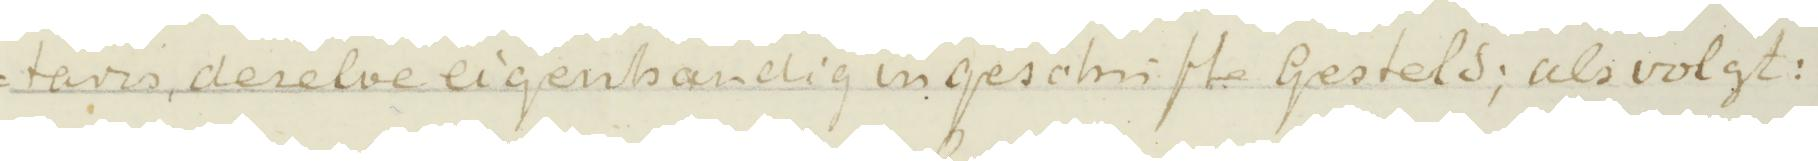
taris dezelve eigenhandig in geschrifte gesteld; als volgt:
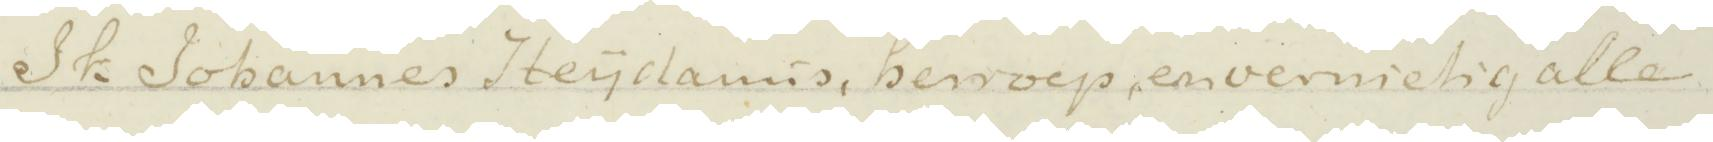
Ik Johanmes Heijdanus, herroep, en vernietig alle
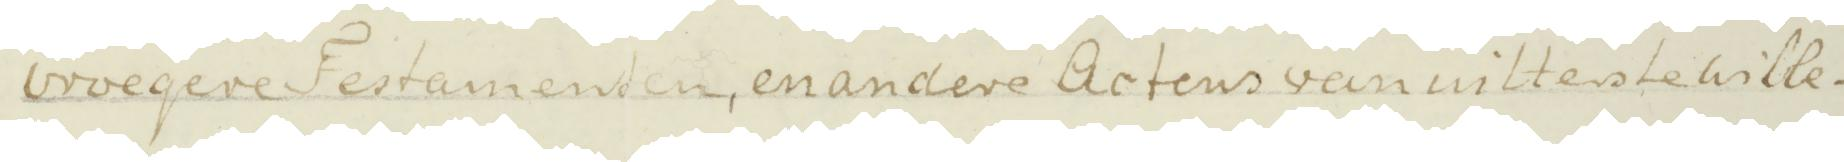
vroegere Testamenten, en andere Actens van uitterste wille
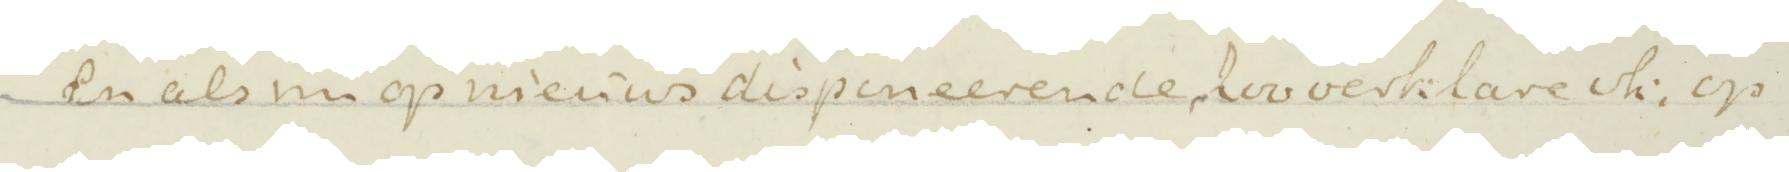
En als nu op nieuws disponeerende, zoo verklare ik: op
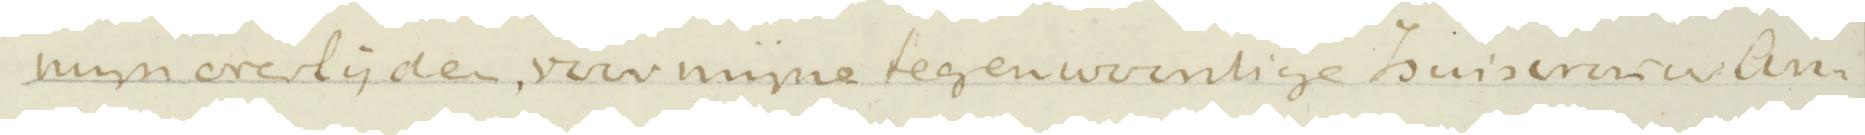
myn overlijden, voor mijne tegenwoordige Huisvrouw An-
